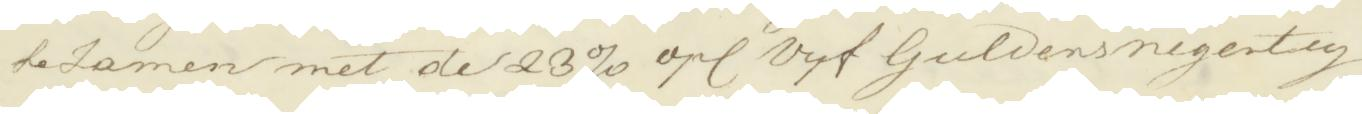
tezamen met de 23% opC: vyf Guldens negentig
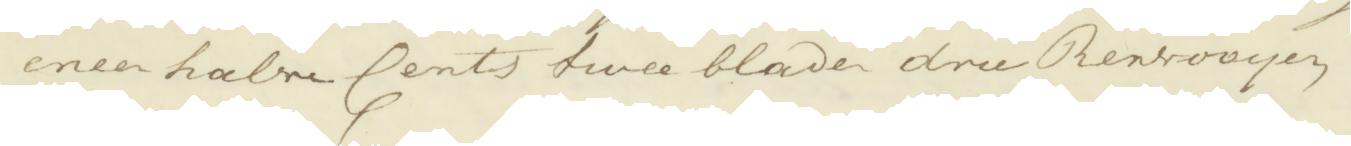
en een halve Cents twee bladen drie Renvooyen
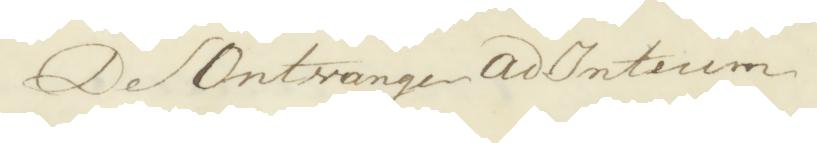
De Ontvanger ad Interim
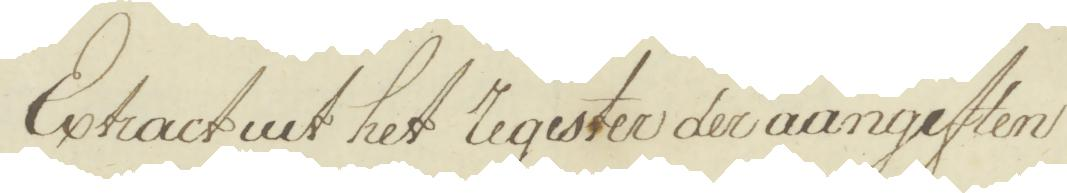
Extract uit het register der aangiften
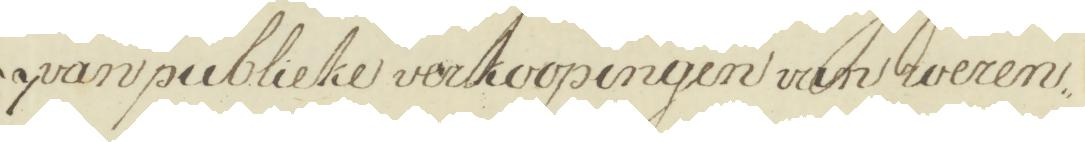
van publieke verkoopingen van roeren„
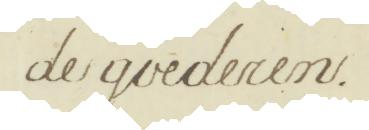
de goederen.
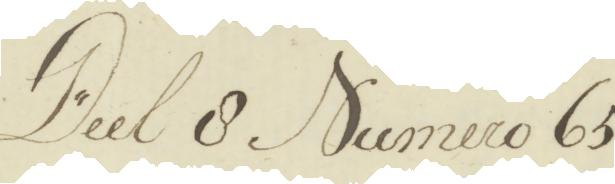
Deel 8 Numero 65
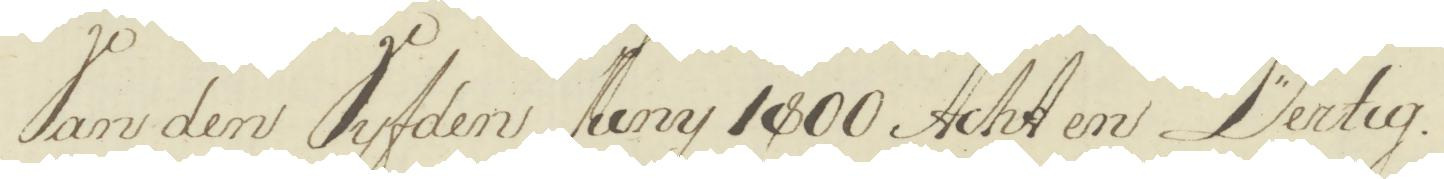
Van den Vijfden Juny 1800 Achten Dertig.
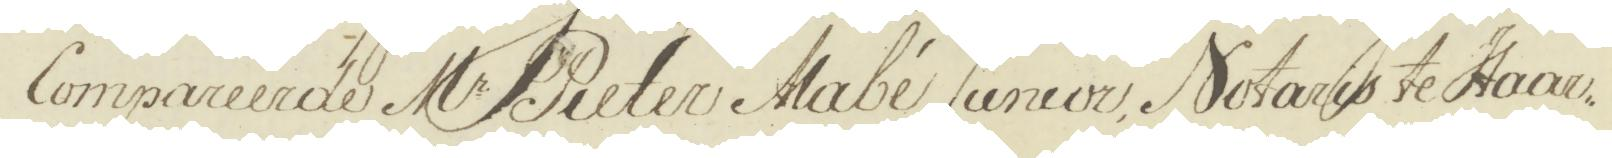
Compareerde Mr. Pieter Mabé Junior, Notaris te Haar„
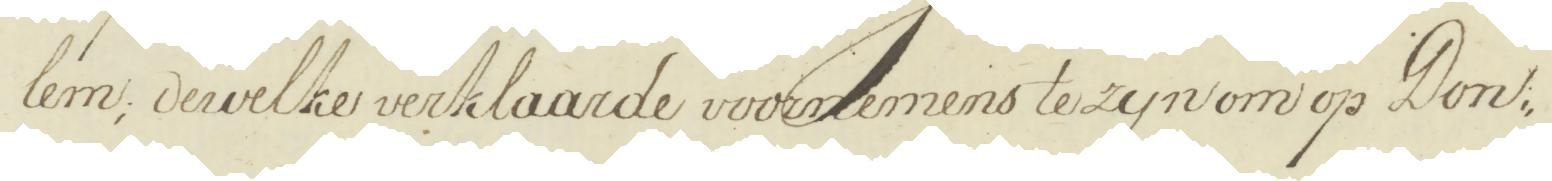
lem; dewelke verklaarde voornemens te zijn om op Don„
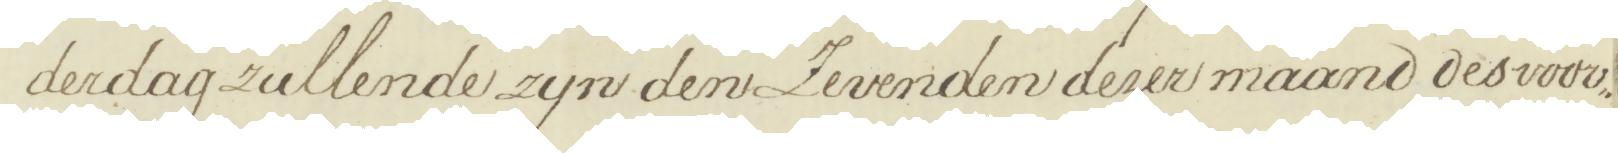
derdag zullende zyn den Zevenden dezer maand des voor
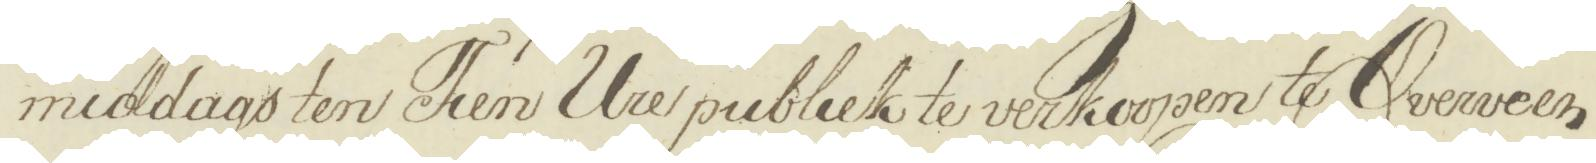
middags ten Tien Ure publiek te verkoopen te Overveen
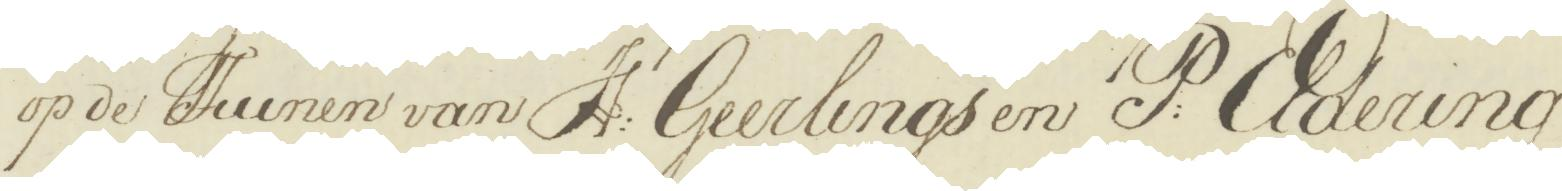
op de Tuinen van H: Geerlings en P: Eldering
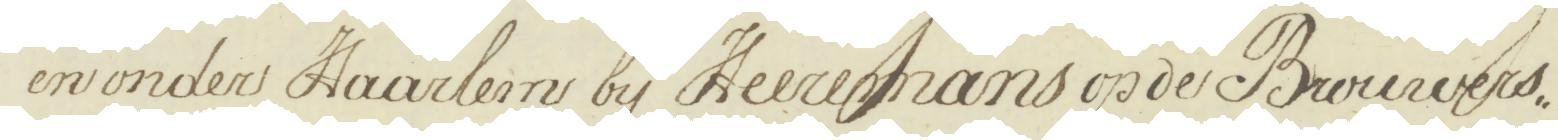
en onder Haarlem bij Heeremans op de Brouwers„
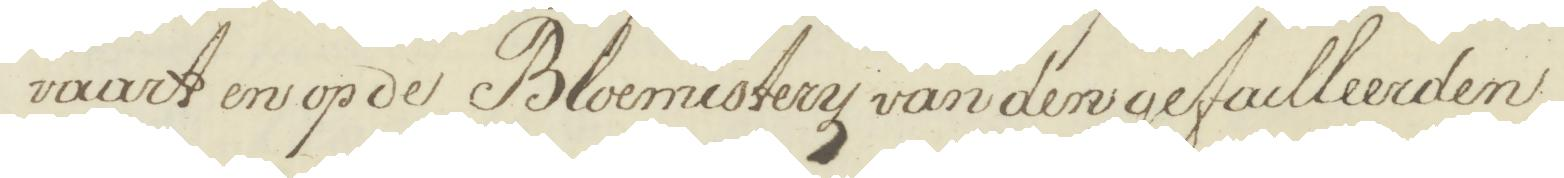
vaart en op de Bloemistery van den gefailleerden
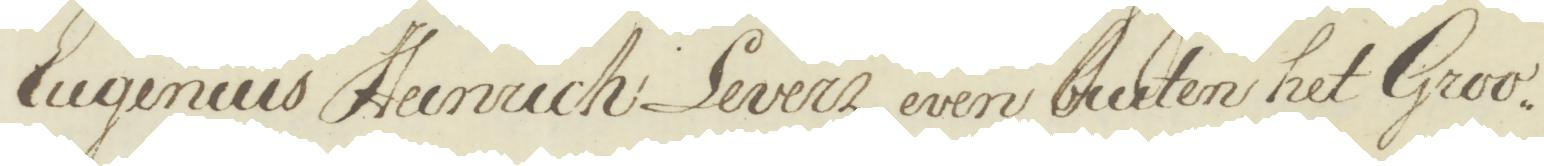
Eugenius Heinrich Leverz even buiten het Groo„
